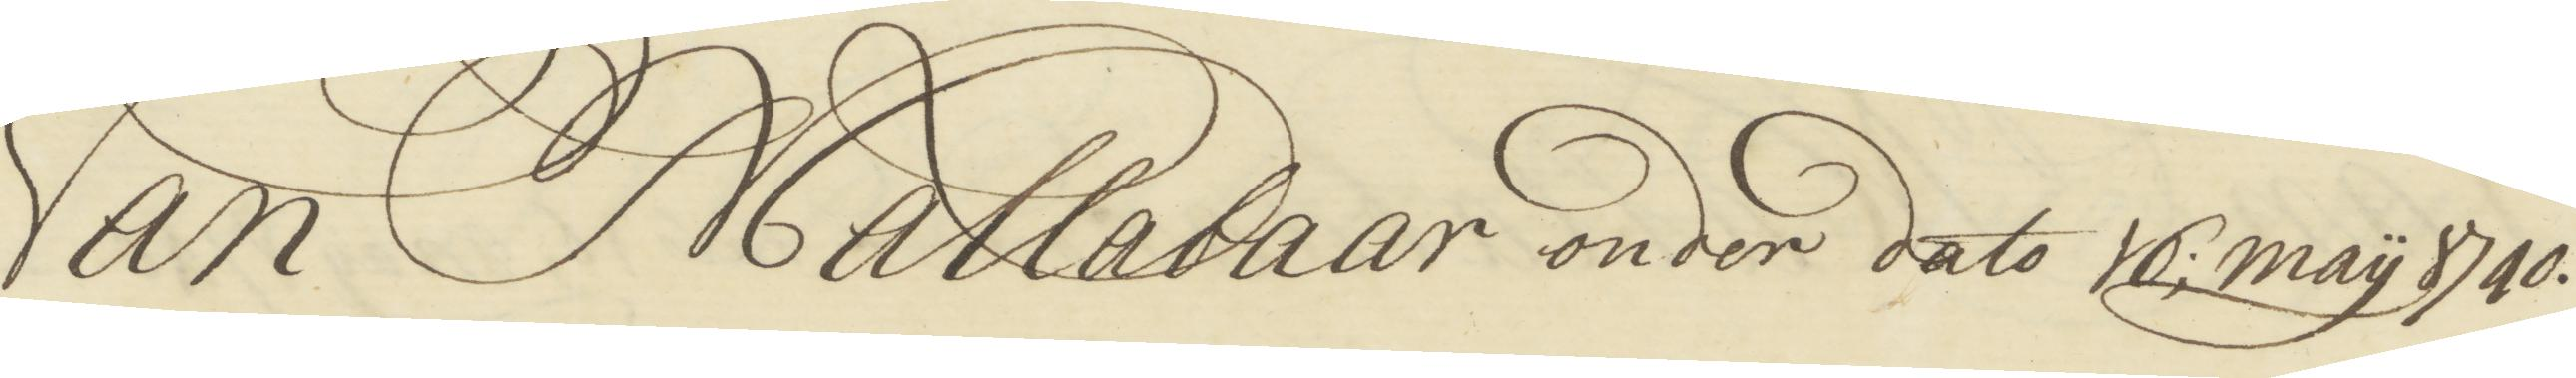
Van Mallabaar onder dato 16; maij 1740.
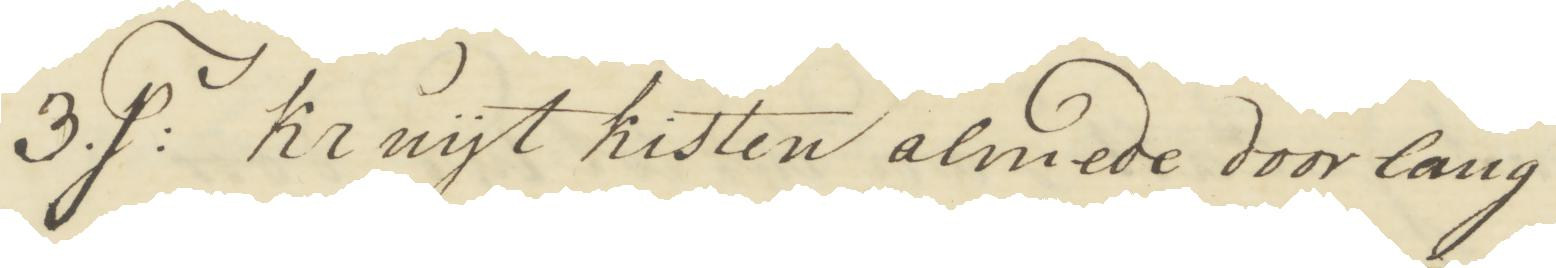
3. p:s kruijt kisten almede door lang
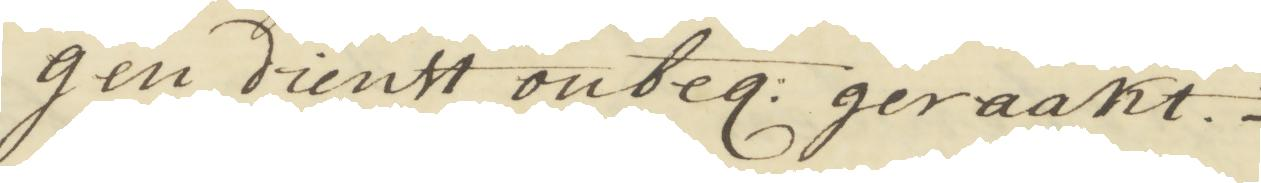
gen dienst onbeq: geraakt.
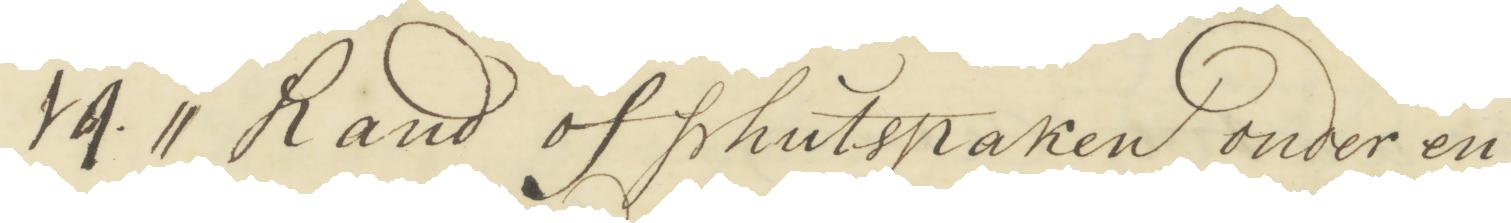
14. „ Hand of schutspaken onder en
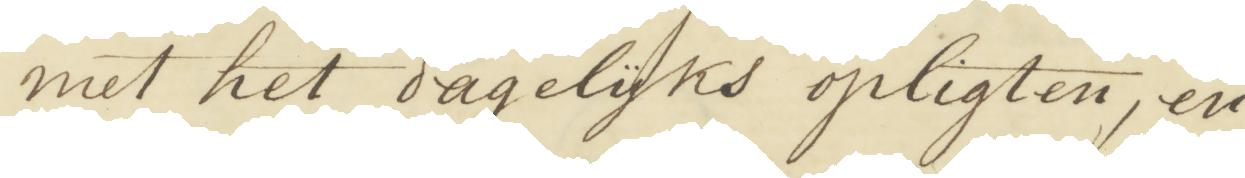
met het dagelijks opligten, en
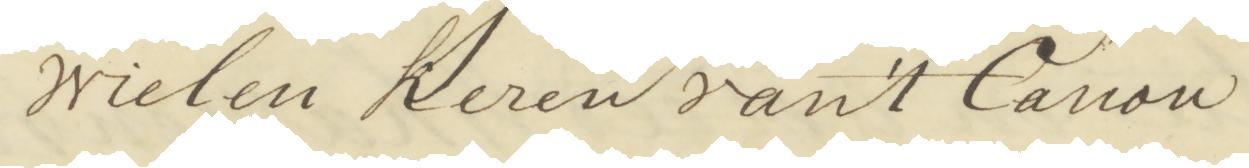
wielen keren van ’t Canon
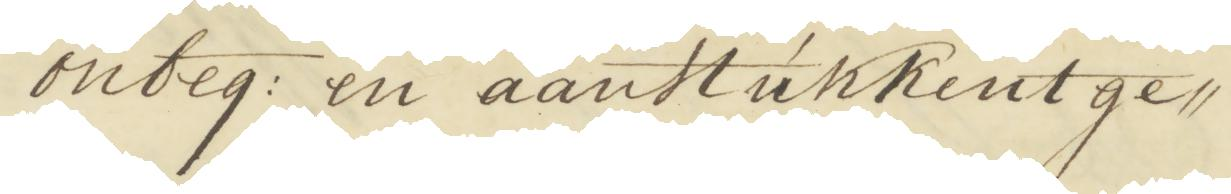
onbeq: en aanstukkent ge„
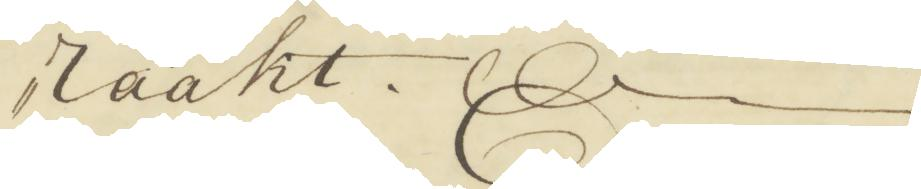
„raakt.
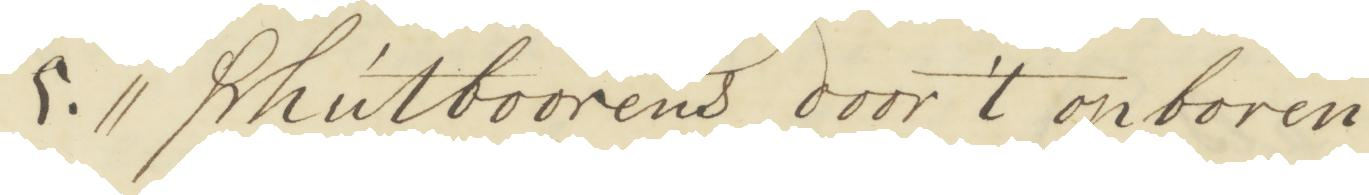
5. „ schutboorens door ’t opboren
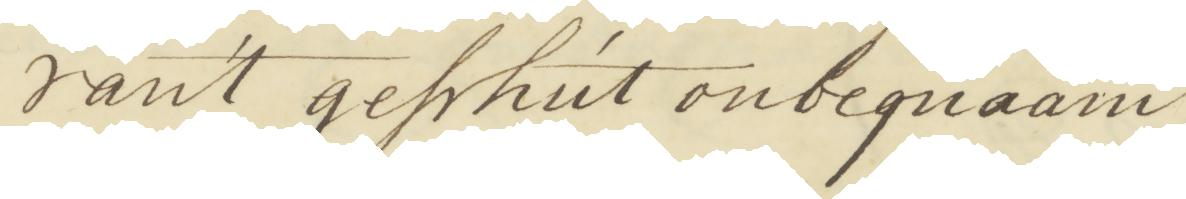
van't geschut onbequaam
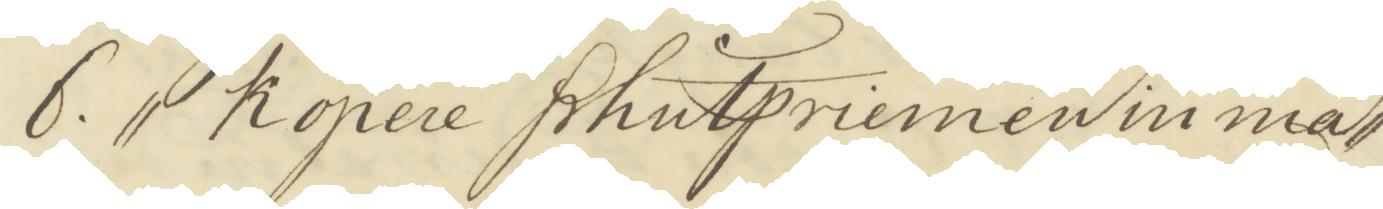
6. „ Kopere schutpriemen in ma
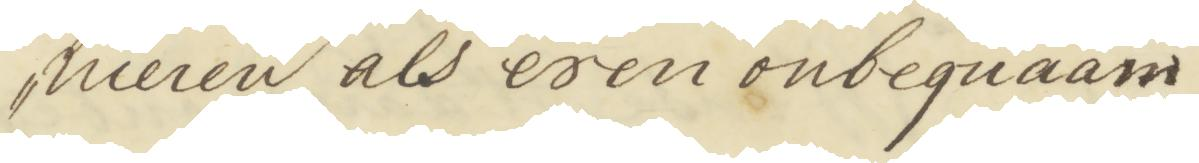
„nieren als even onbequaam
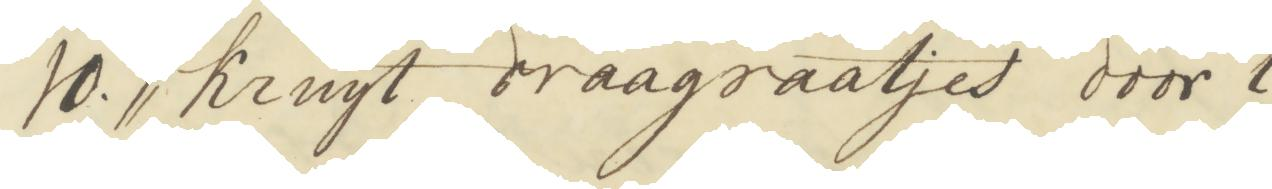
10. „ kruijt draagvaatjes door 't
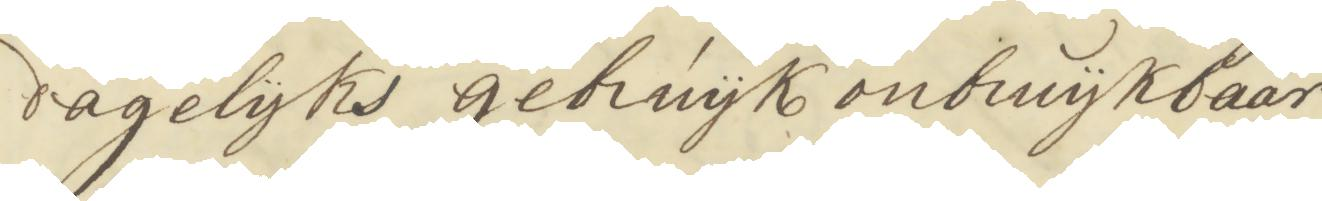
dagelijks gebruijk onbruijkbaar
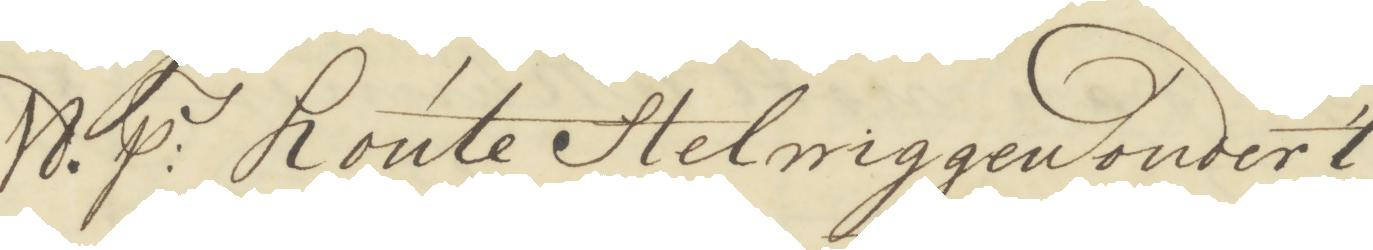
18. p:s Houte stelwiggen onder 't
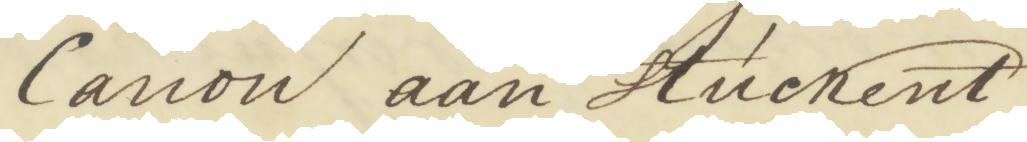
Canon aan stuckent
